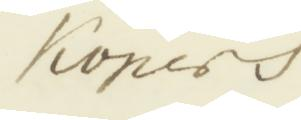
Kopers
